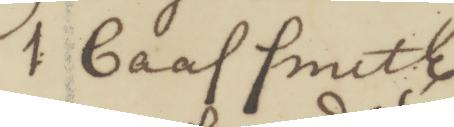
1 baas smith
